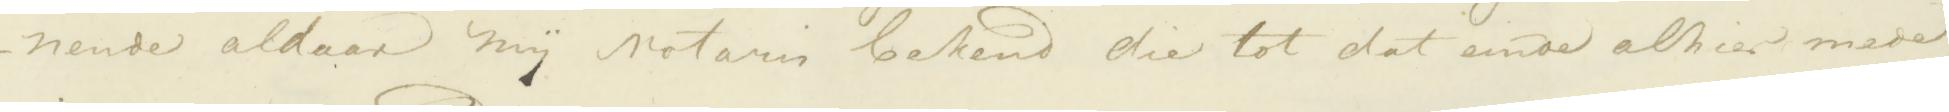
nende aldaar mij Notaris bekend die tot dat einde alhier mede
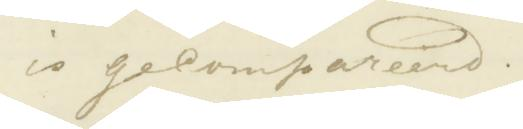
is gecompareerd.
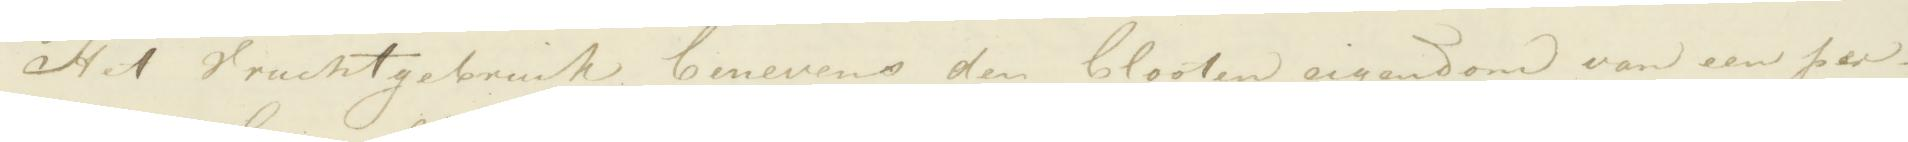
Het vruchtgebruik, benevens den blooten eigendom van een per
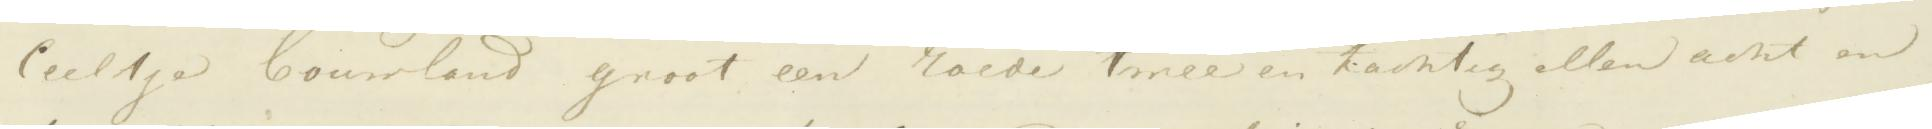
teeltje bouwland groot een roede twee en tachtig ellen acht en
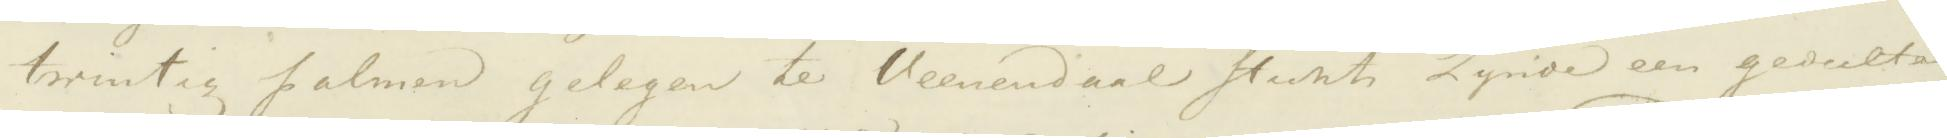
twintig palmen gelegen te Veenendaal stichts zijnde een gedeelte
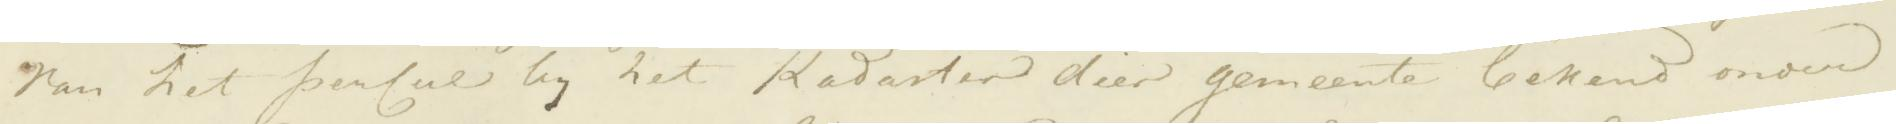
van het perceel bij het Kadaster dier gemeente bekend onder
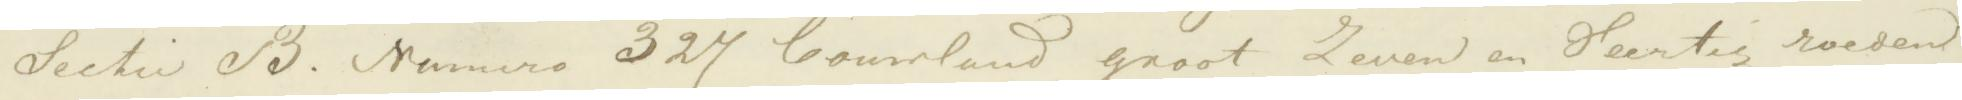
Sectie B. Numero 327 bouwland groot Zeven en Veertig roeden
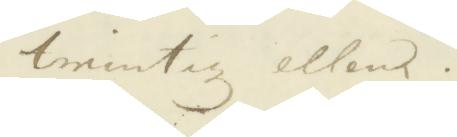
twintig ellen.
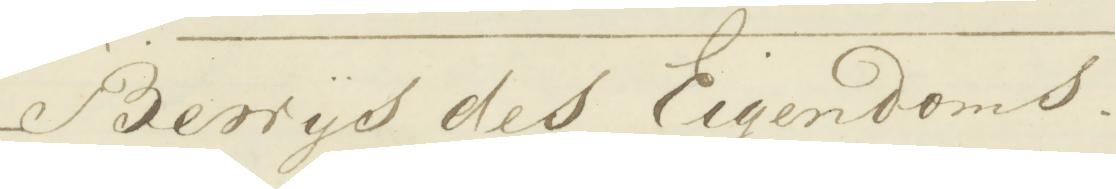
-Bewijs des Eigendoms.
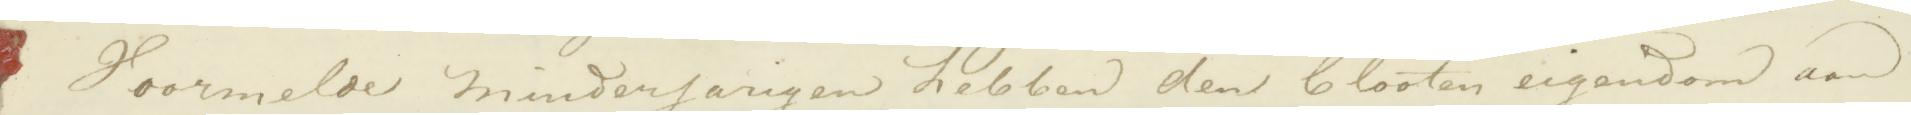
Voormelde minderjarigen hebben den blooten eigendom aan
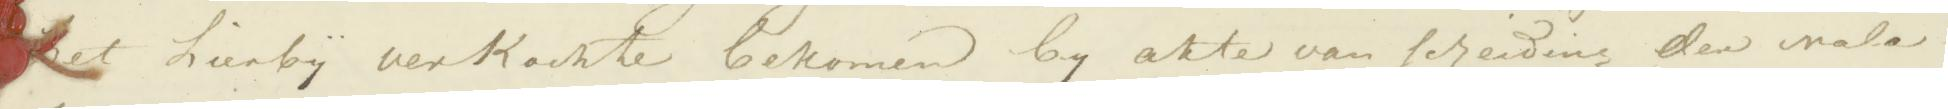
het hierbij verkochte bekomen bij akte van scheiding der nala
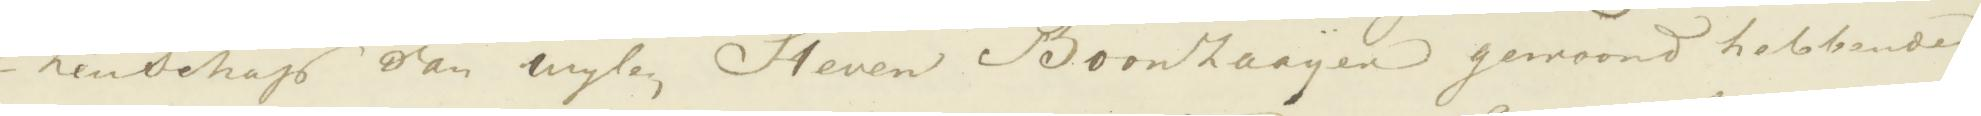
=tenschap van wijlen Steven Boonzaaijer gewoond hebbende
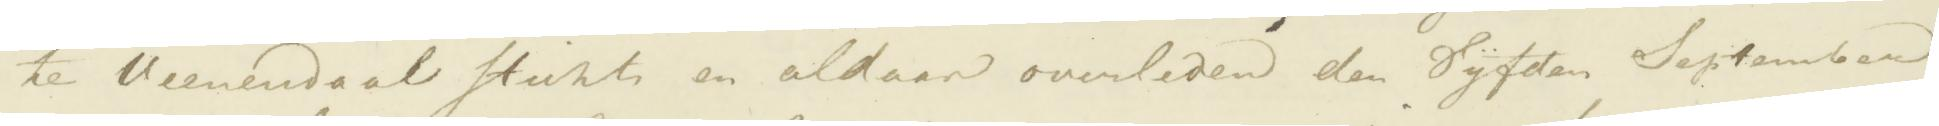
te Veenendaal stichts en aldaar overleden den Vijfden September
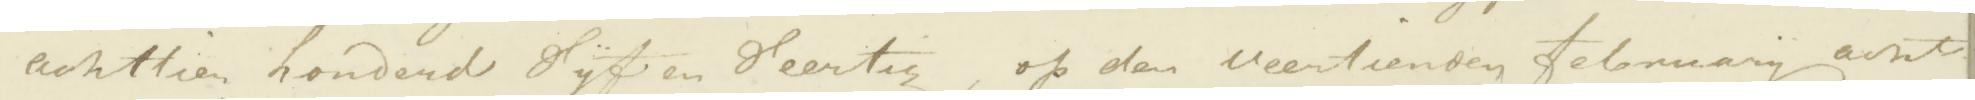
achttien honderd Vijf en Veertig, op den veertienden februarij acht
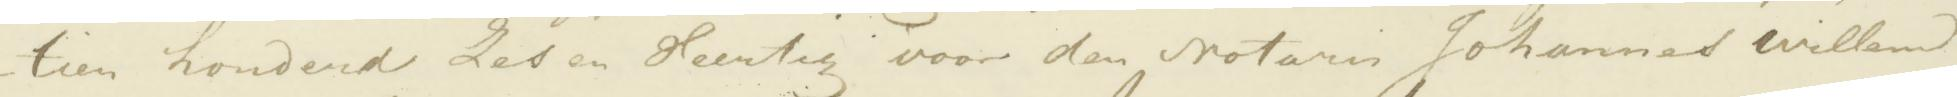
tien honderd Zes en Veertig voor den Notaris Johannes Willem
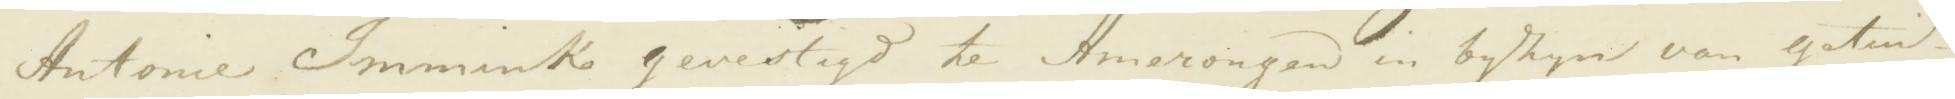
Antonie Immink gevestigd te Amerongen in byzyn van getui
